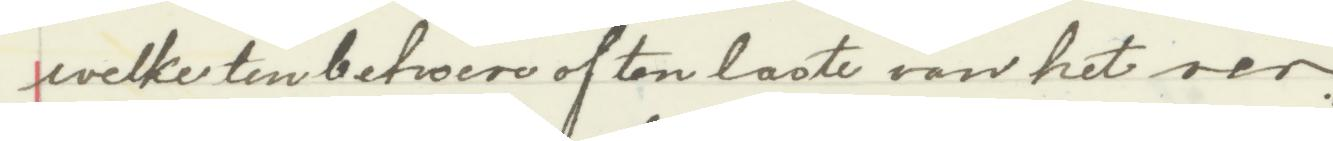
welke ten behoeve of ten laste van het ver
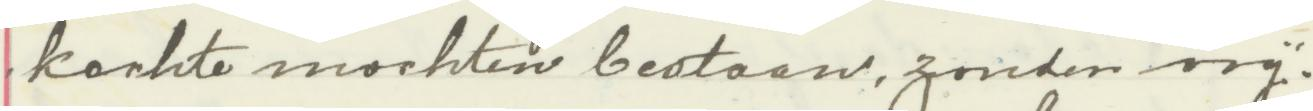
„kochte mochten bestaan, zonder vrij
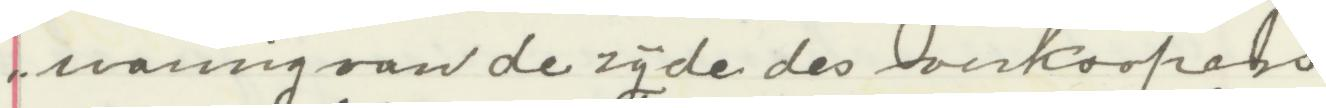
„waring van de zijde des verkoopers
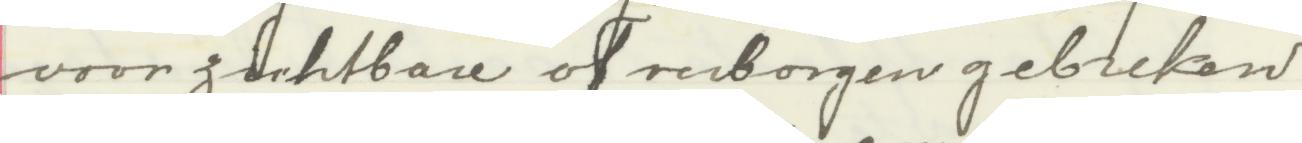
voor zichtbare of verborgen gebreken
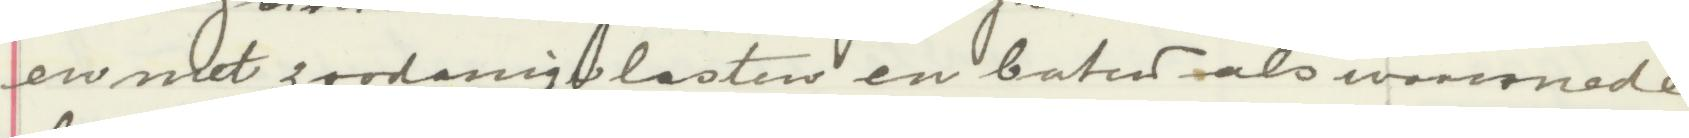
en met zoodanige lasten en baten als waarmede
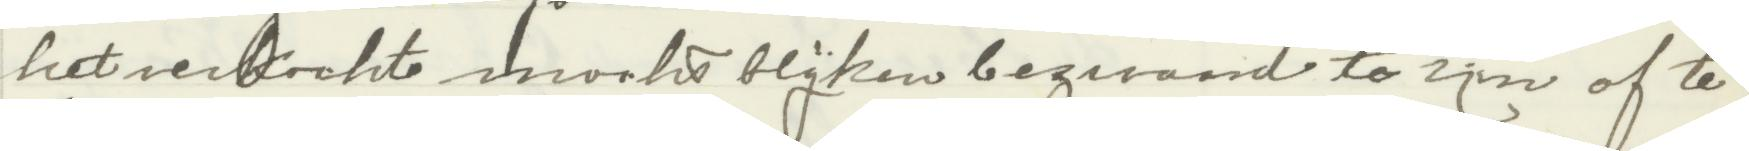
het verzocht mocht blijken bezwaard te zijn of te
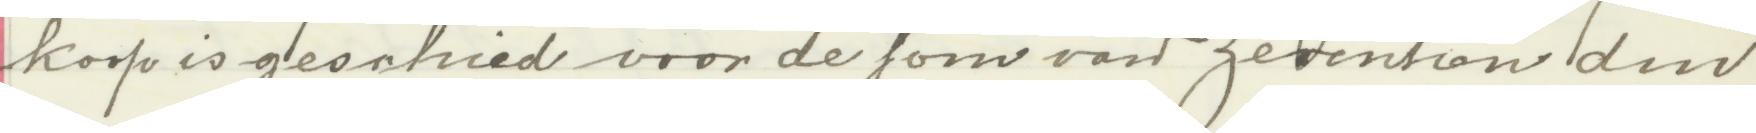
koop is geschied voor de som van Zeventien dui
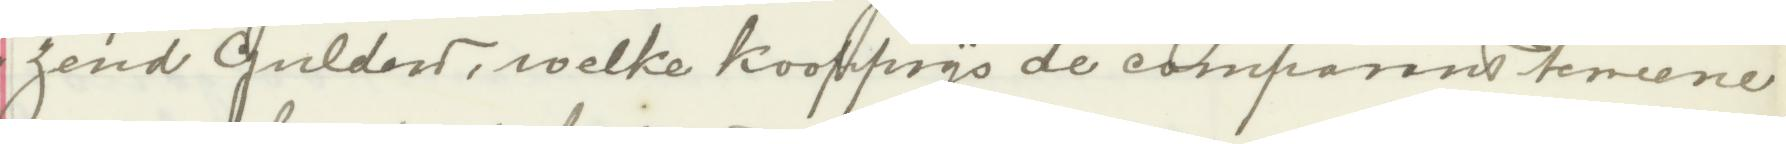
zend Gulden, welke koopprijs de comparant ter eene
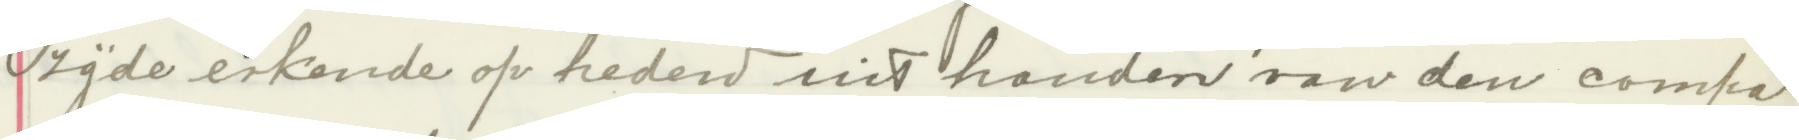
zijde erkende op heden uit handen van den compa
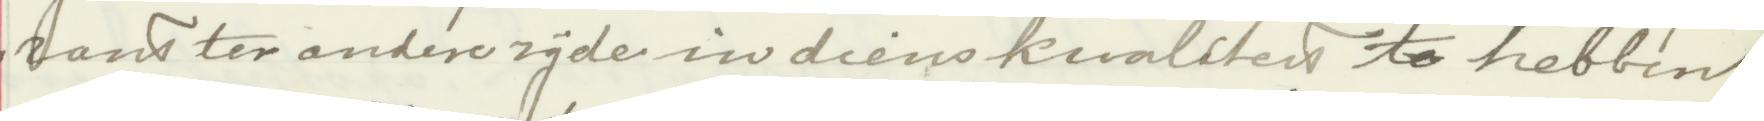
rant ter andere zijde in diens kwaliteit te hebben
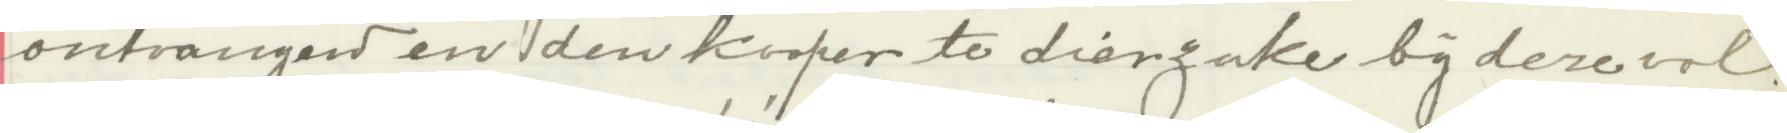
ontvangen en den kooper te dierzake bij deze vol
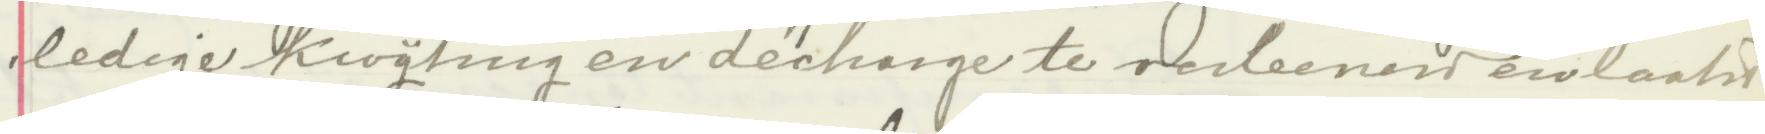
„ledige kwijting en decharge te verleenen en laatst
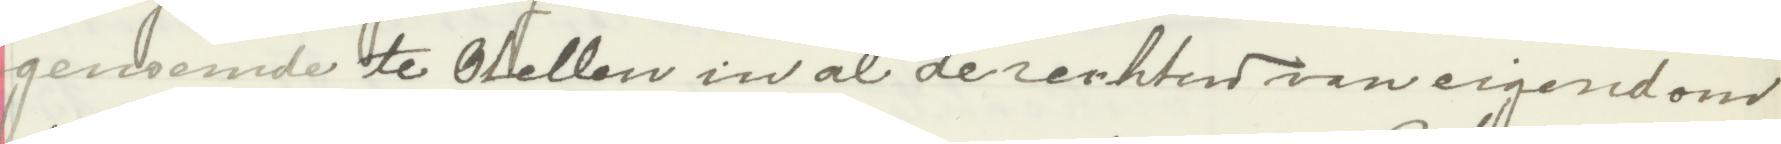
genoemde te stellen in al de rechten van eigendom
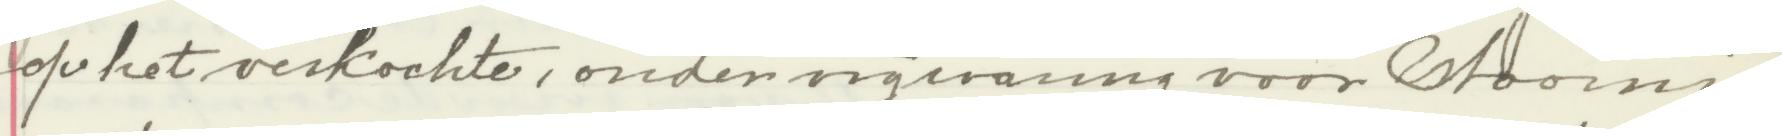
op het verkochte, onder vrijwaring voor stoornis,
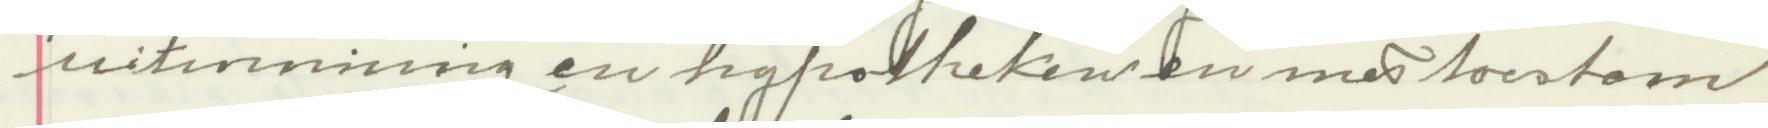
uitwinning en hypoheken en met toestem
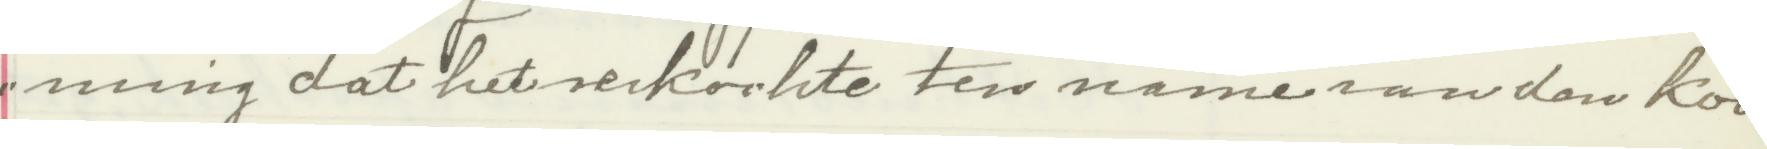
„ming dat het verkochte ten name van den koo
